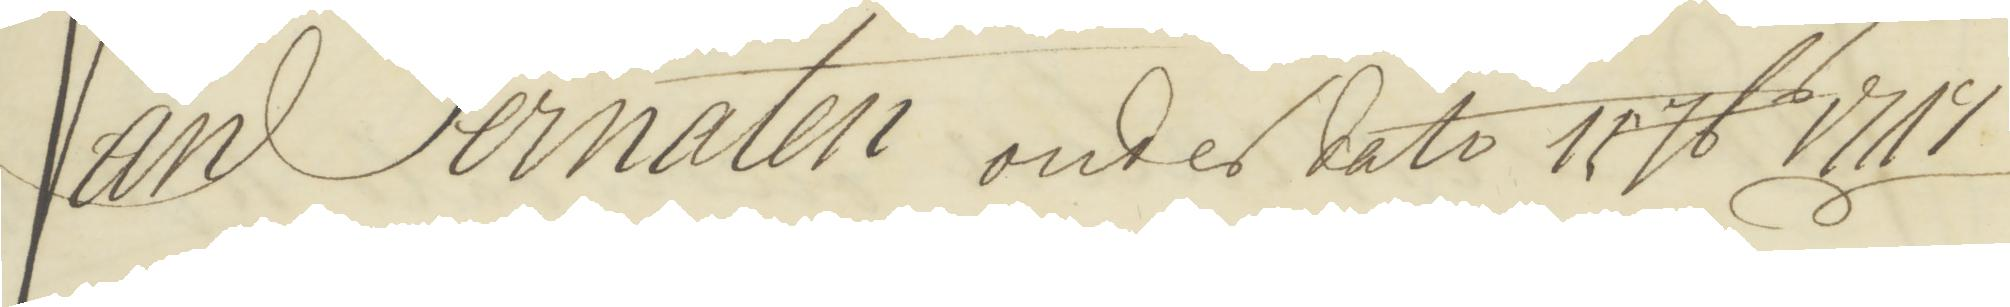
Van Ternaten onder dato 15 7bs 1747
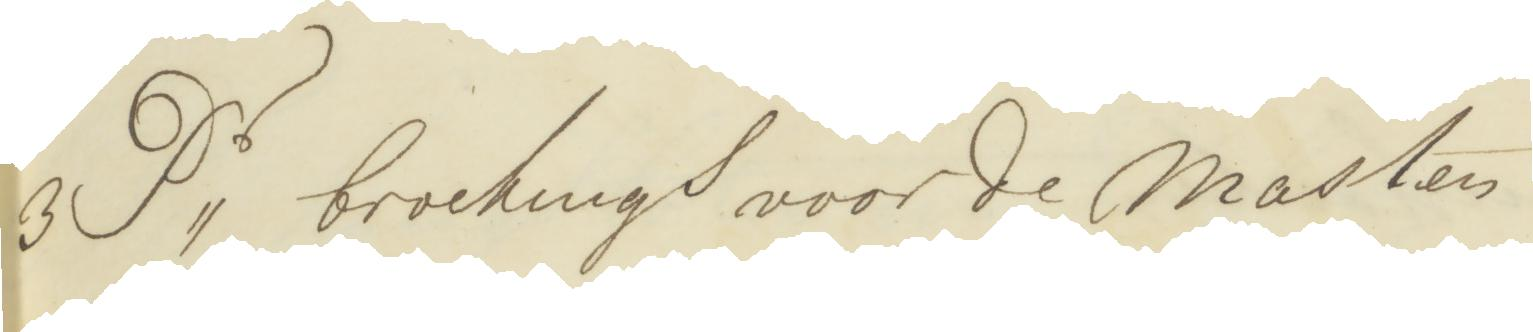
3 P„s broekings voor de masten
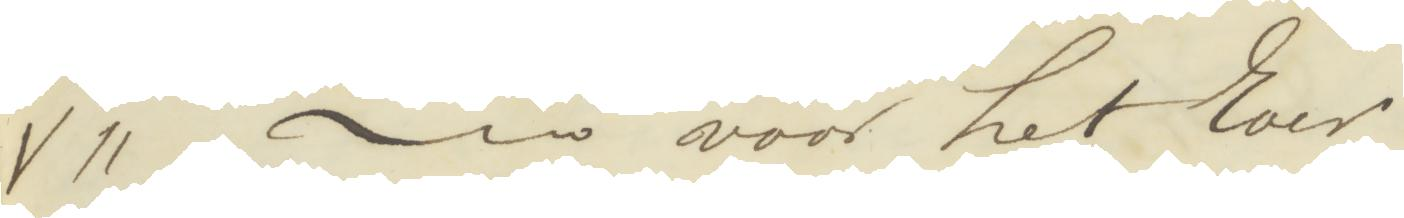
1 „ _o voor het roer
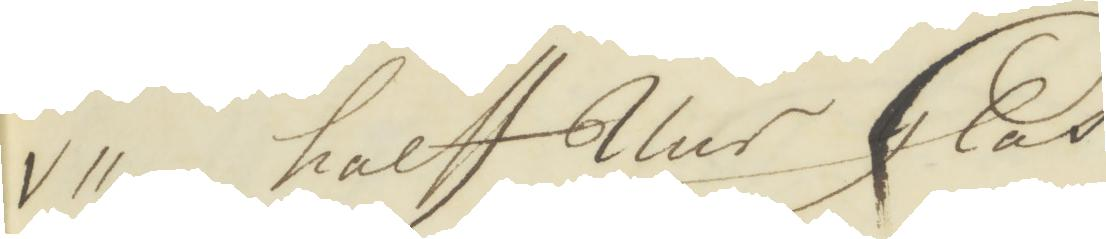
1 „ halff Uur Glas
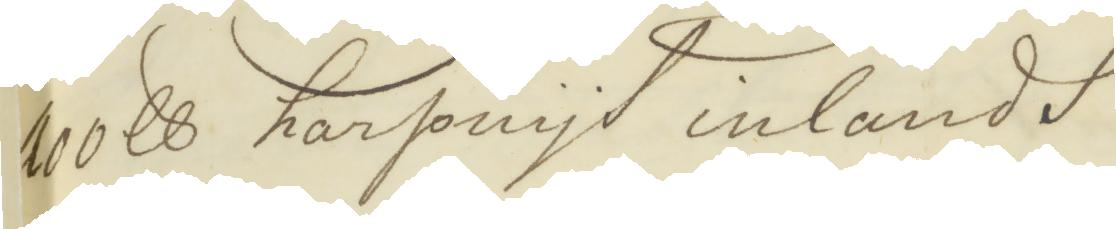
400 lb harpuijs inlands
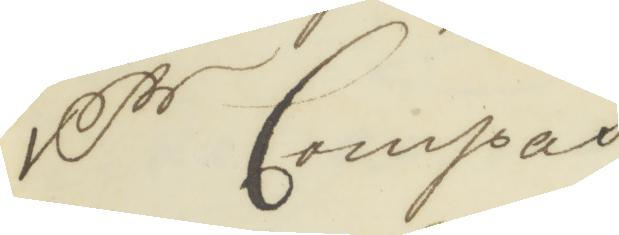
1 Ps Compas
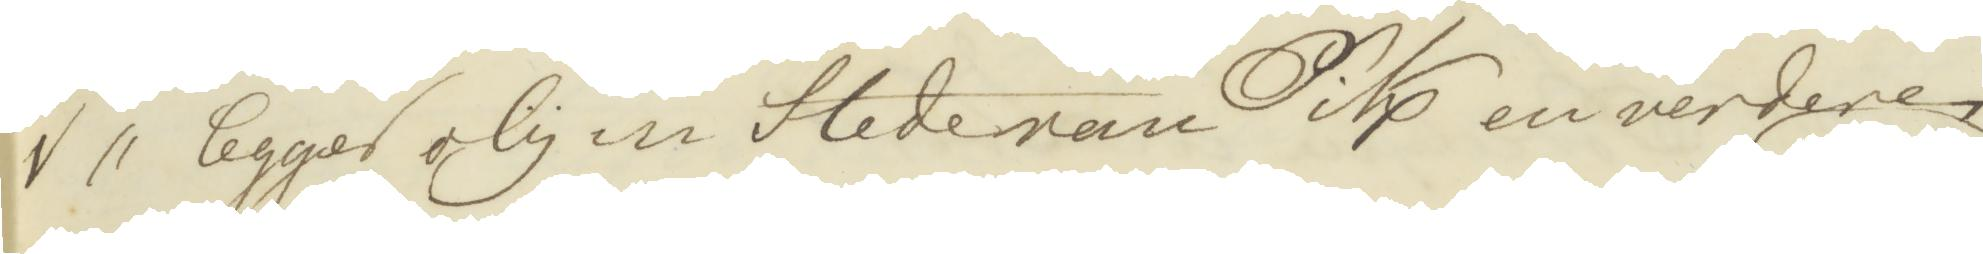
1 „ legger olij in stede van Pik en verdere
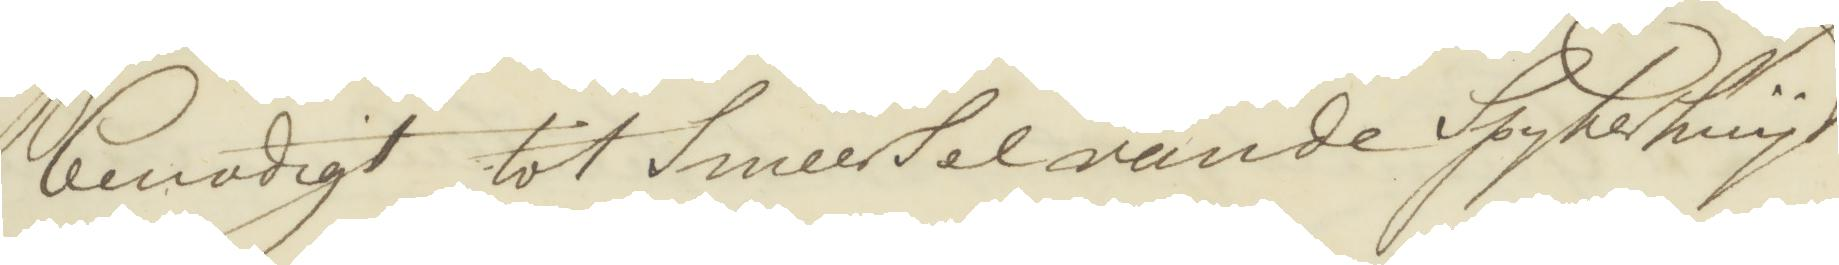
benodigt tot smeersel van de spykerhuijt
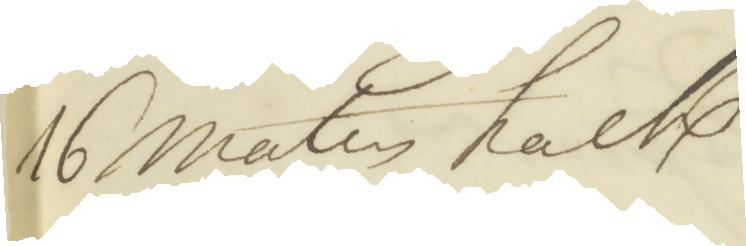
16 maten kalk
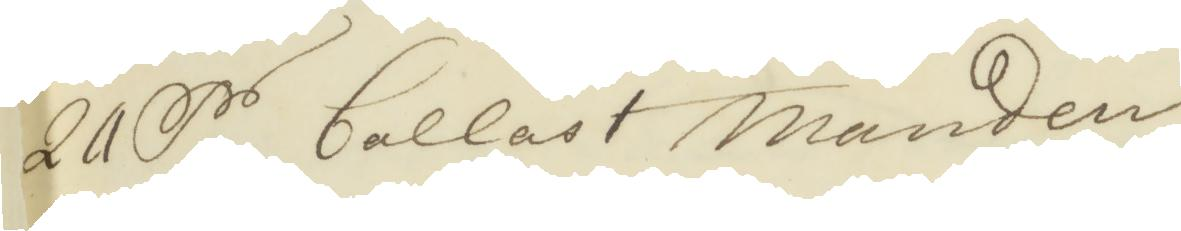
24 Ps ballast manden
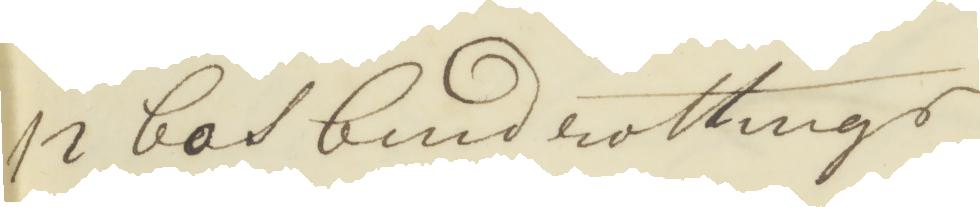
12 bos bindrottings
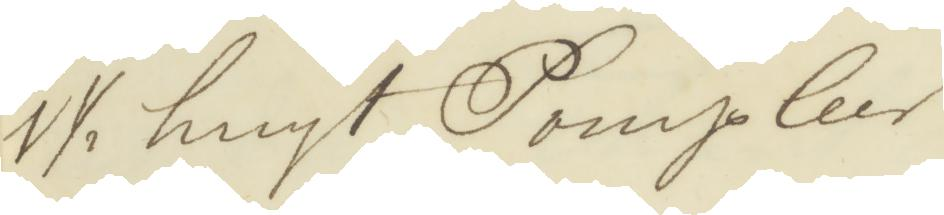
1½ huyt Pompleer
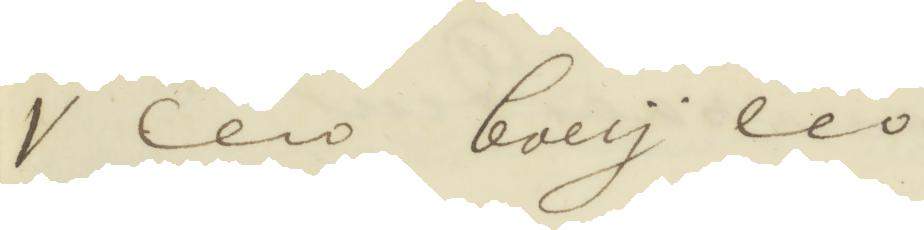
1 Een boeij ceo
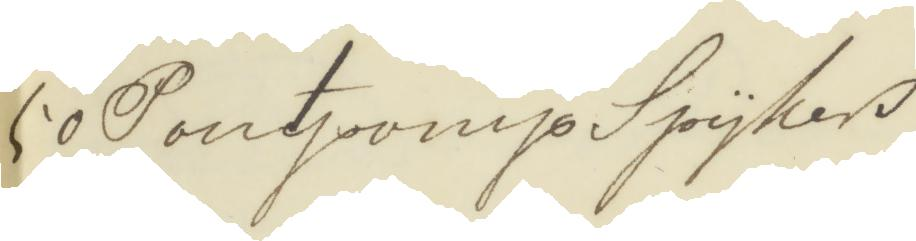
50 Pont pomp spijkers
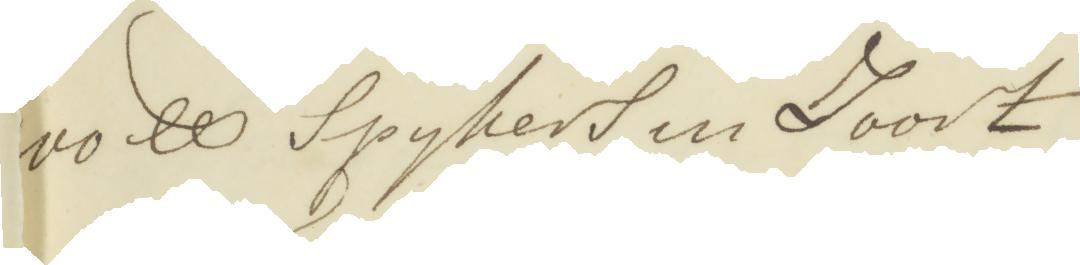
10 lb spijkers in zoort
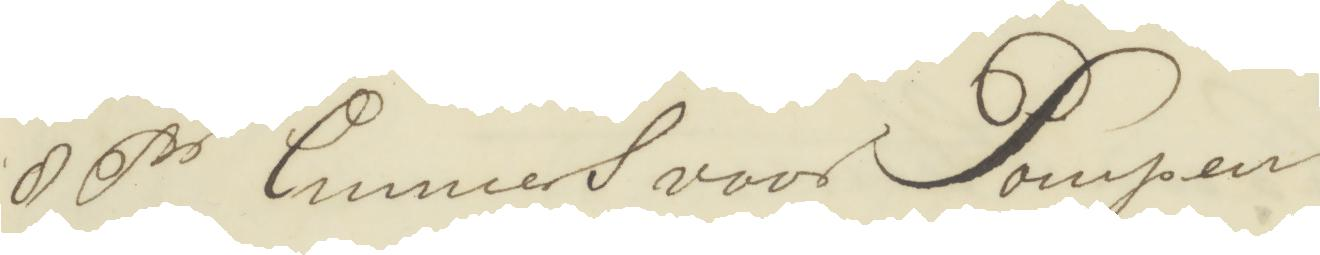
8 Ps bunners voor Pompen
